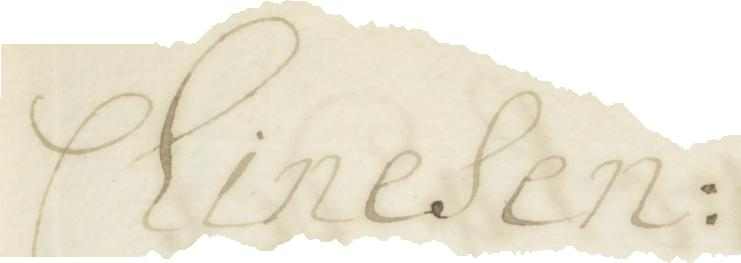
Chinesen:
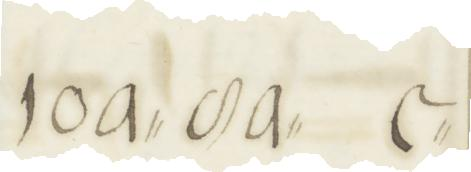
104„84„ 5„
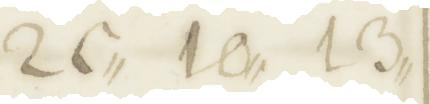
25„ 10„ 13„
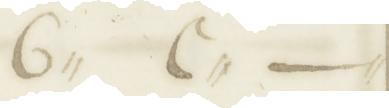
6„ 5„ —„
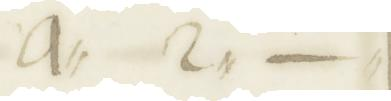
4„ 2„ —„
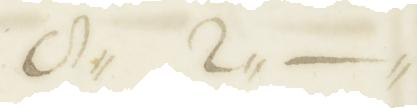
8„ 2„ —„
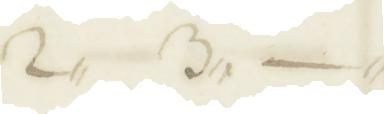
2„ 3„ —„
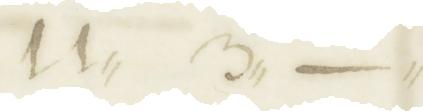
11„ 3„ —„
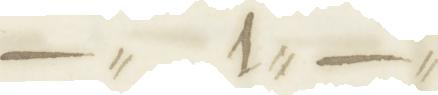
—„ 1„ —„
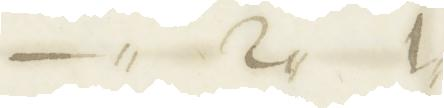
—„ 2„ 1„
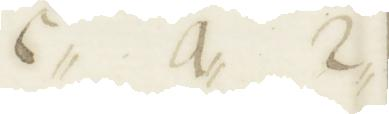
5„ 4„ 2„
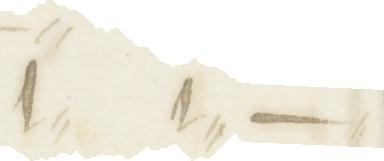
1„ 1„—„
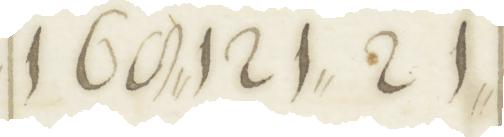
168„121„21„
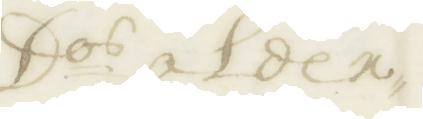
D=os alder„
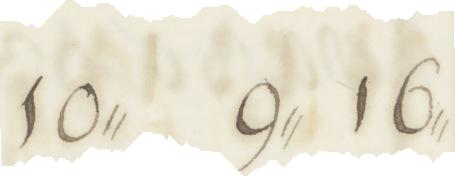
10„ 9„ 16„
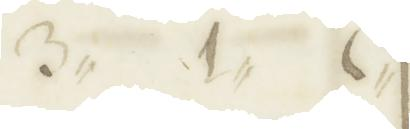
3„ 1„ 5„
